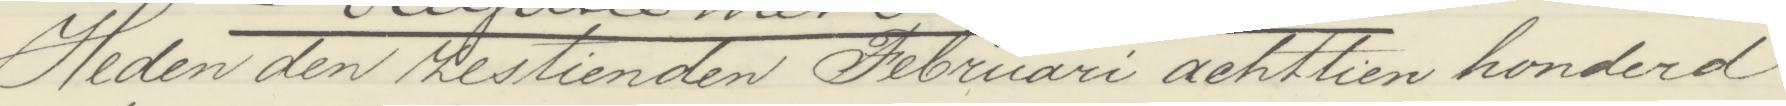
Heden den zestienden Februari achttien honderd
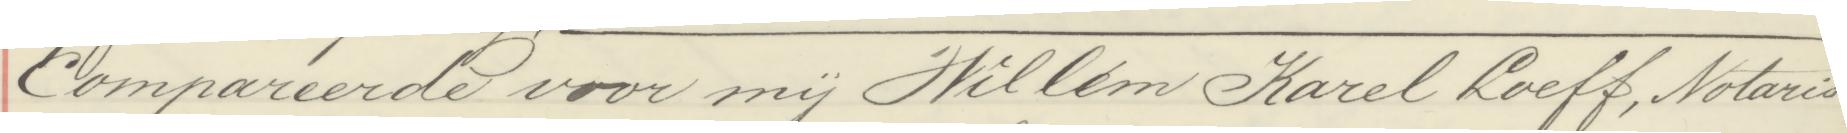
Compareerde voor mij Willem Karel Loeff, Notaris
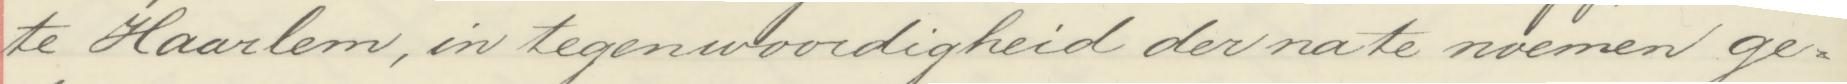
te Haarlem, in tegenwoordigheid der na te noemen ge=
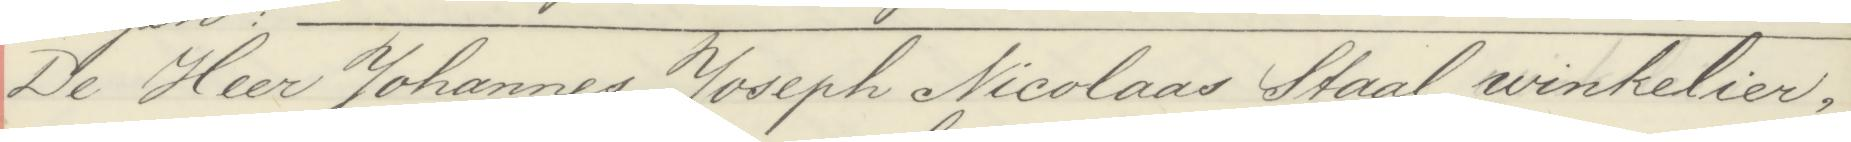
De Heer Johannes Joseph Nicolaas Staal, winkelier,
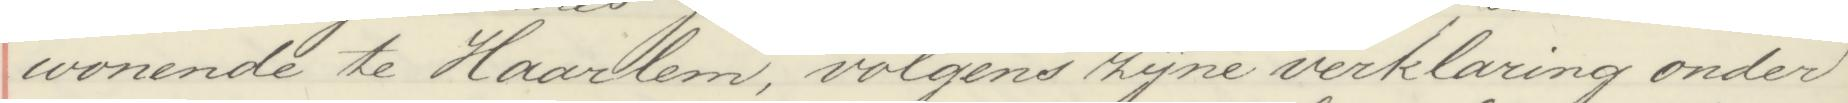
wonende te Haarlem, volgens zijne verklaring onder
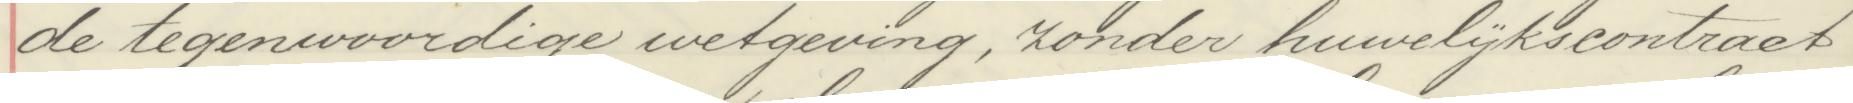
de tegenwoordige wetgeving, zonder huwelijks contract
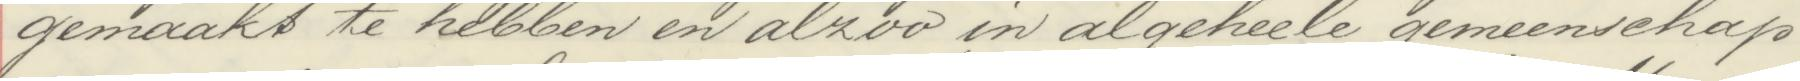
gemaakt te hebben en alzoo in algeheele gemeenschap
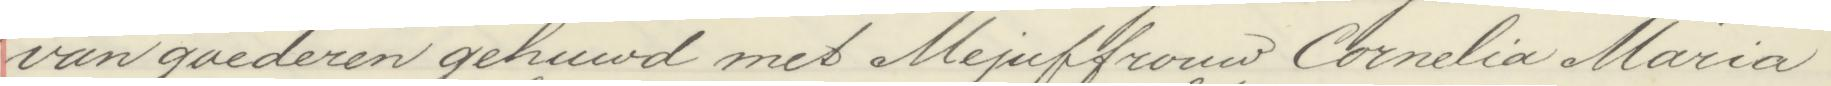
van goederen gehuwd met Mejuffrouw Cornelia Maria
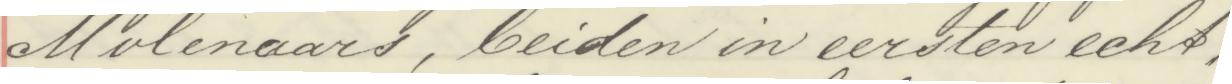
Molenaars, beiden in eersten echt,
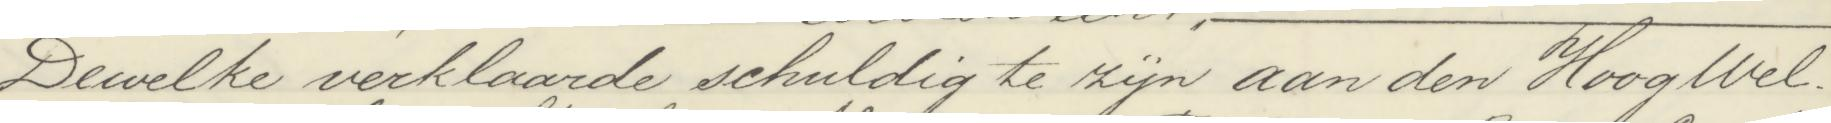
Dewelke verklaarde schuldig te zijn aan den Hoog Wel.
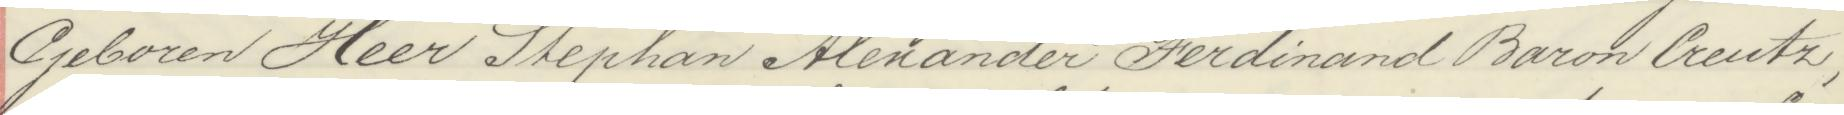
Geboren Heer Stephan Alexander Ferdinand Baron Creutz
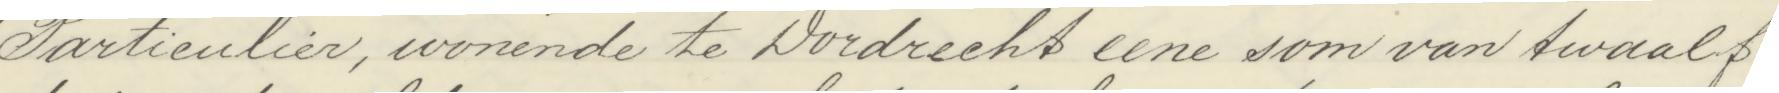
Particulier, wonende te Dordrecht eene som van twaalf
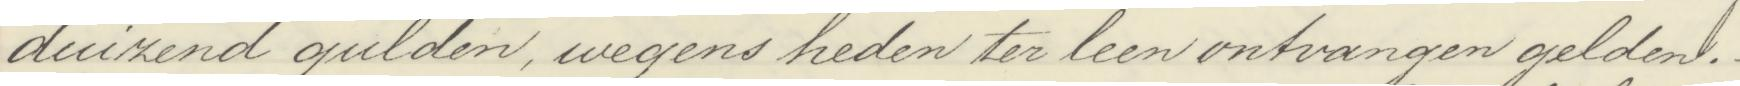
duizend gulden, wegens heden ter leen ontvangen gelden.
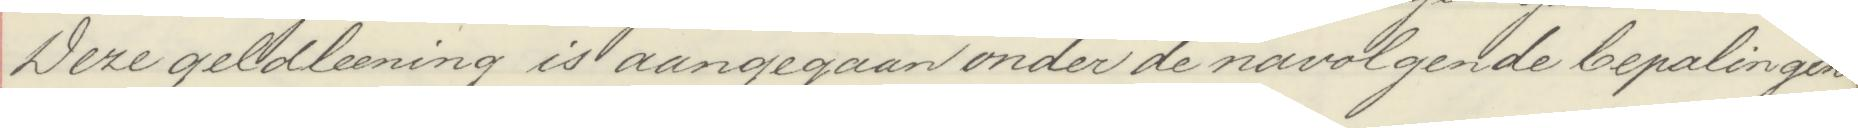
Deze geldleening is aangegaan onder de navolgende bepalingen
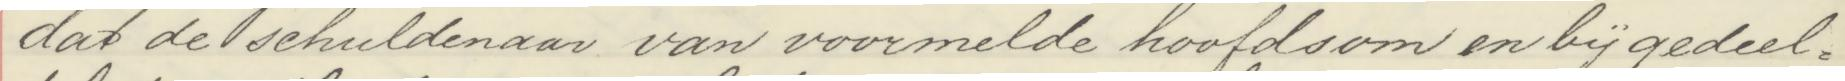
dat de schuldenaar van voormelde hoofdsom en bij gedeel=
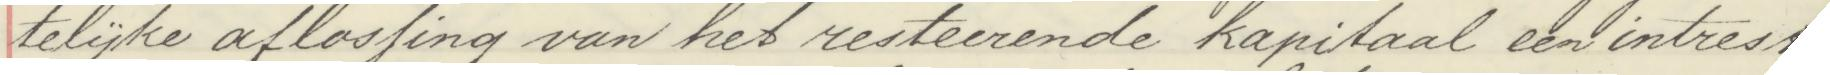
telijke aflossing van het resteerende kapitaal een intrest
